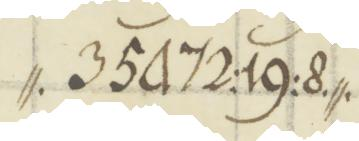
„ 35472:19:8.„
